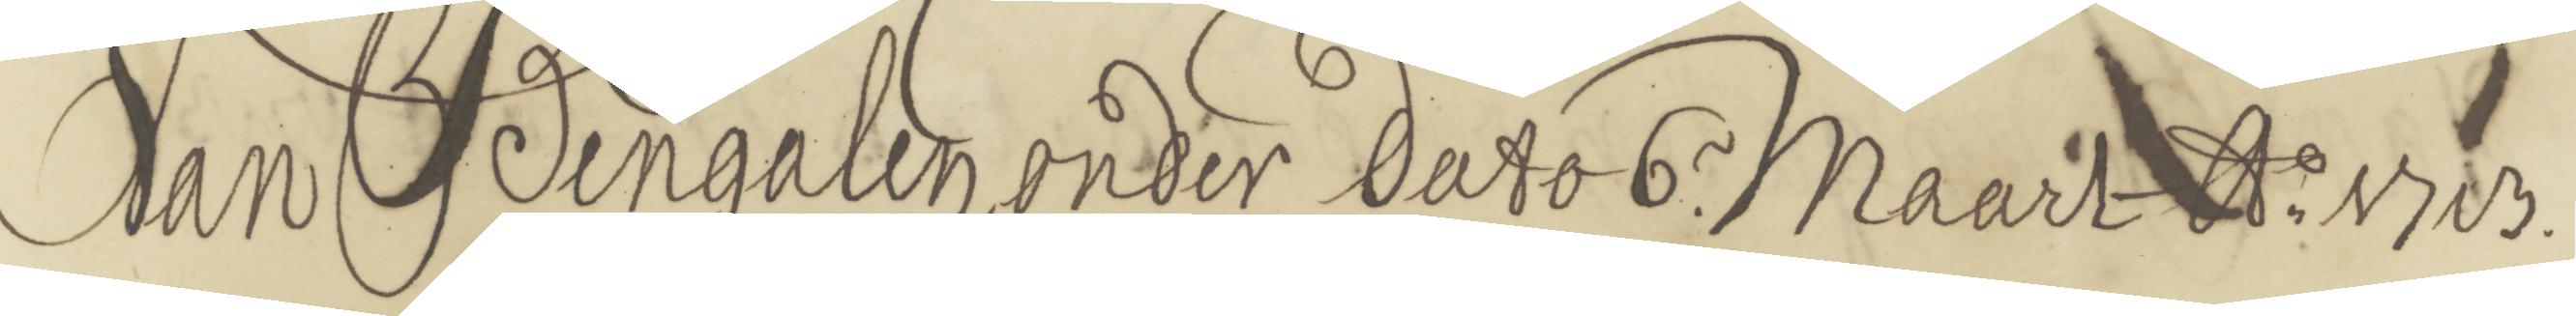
Van Bengalen onder dato 6.' Maart A„o 1713.
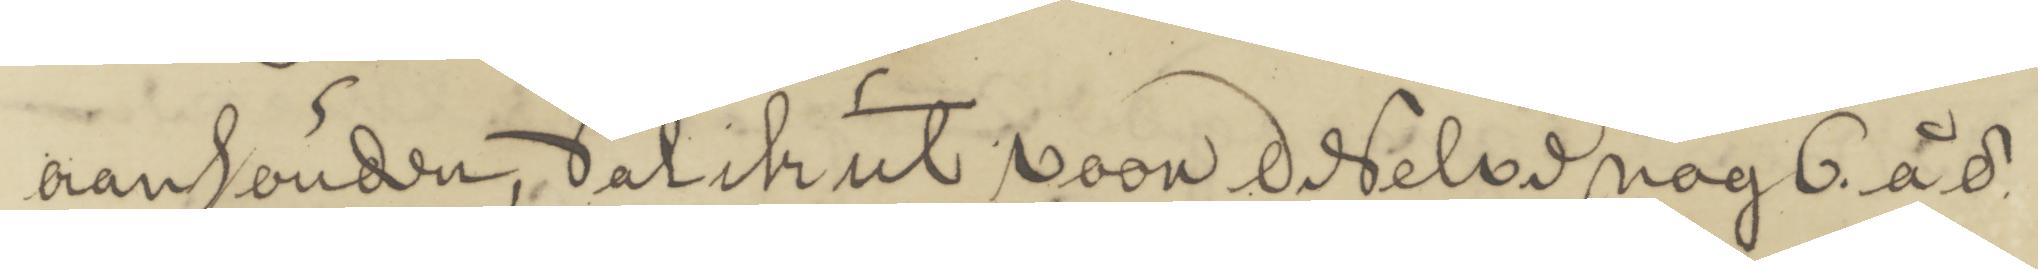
aanhouden, sal ik uL voor deselve nog 6. â 8.
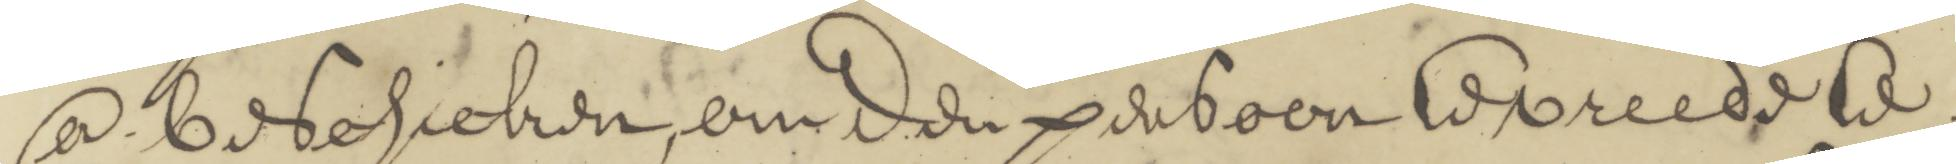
@ beschicken, om Een persoon te vreede te
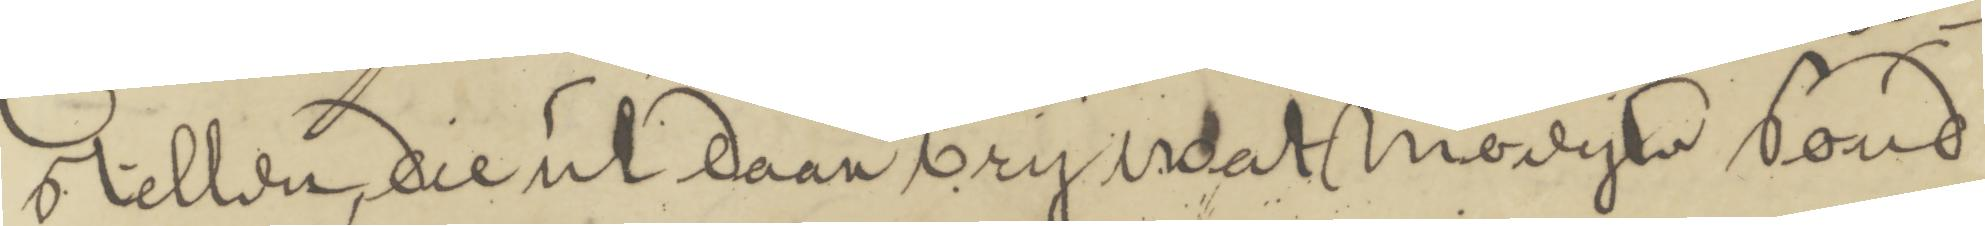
stellen, die uL daar vrij wat moeijte soud
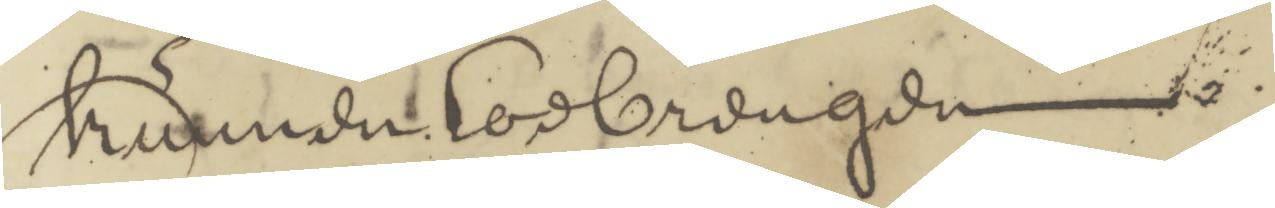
kunnen toebrengen.
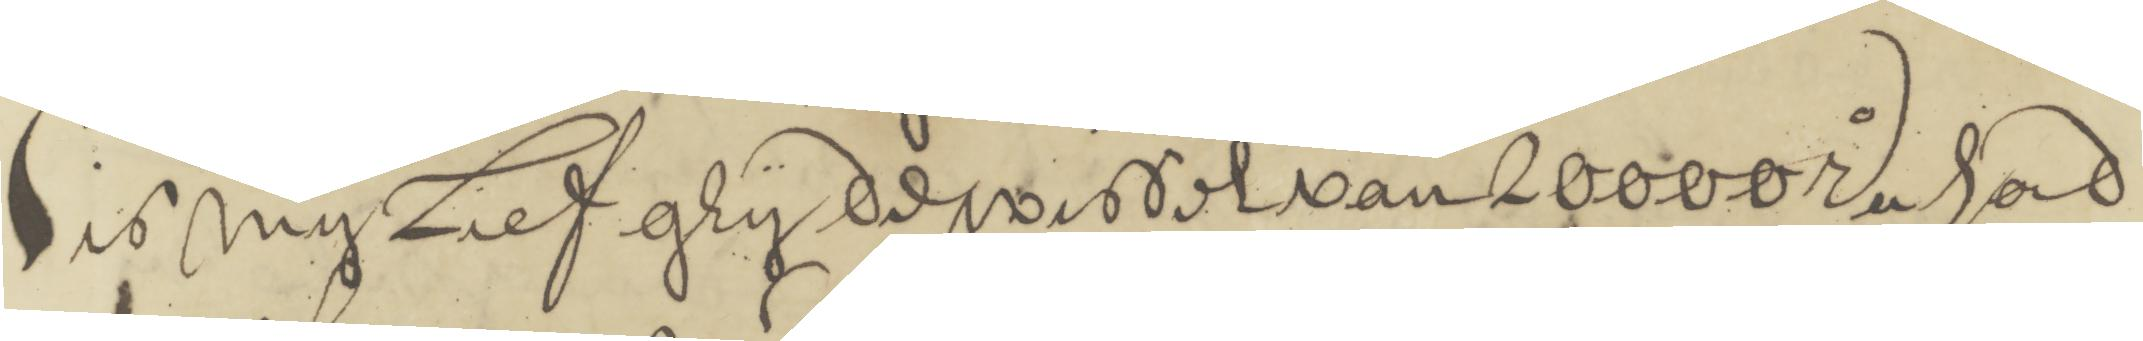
t is mij lief ghij de wissel van 20000 ro/a had
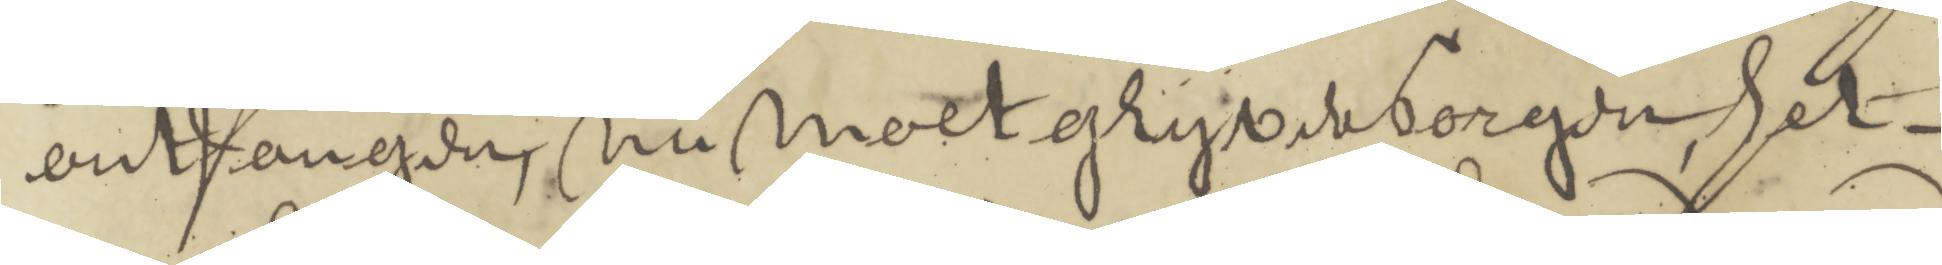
ontfangen, nu moet ghij versorgen, het
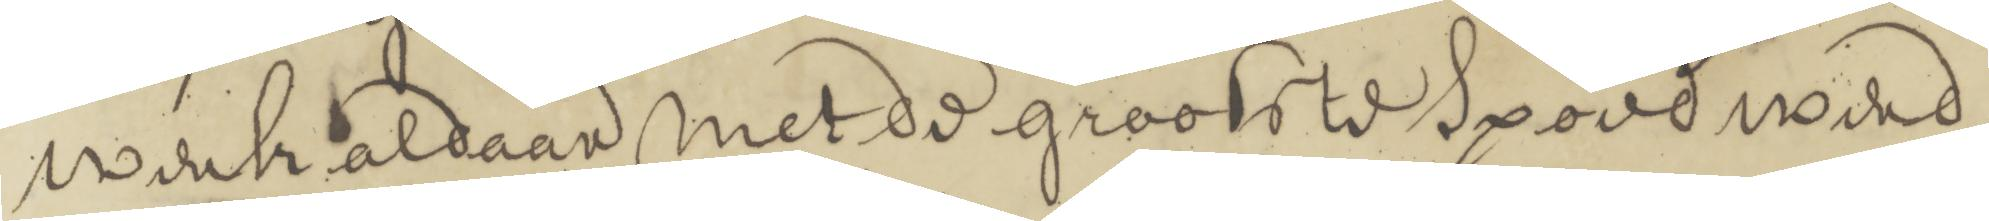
werk aldaar met de grootste spoed werd
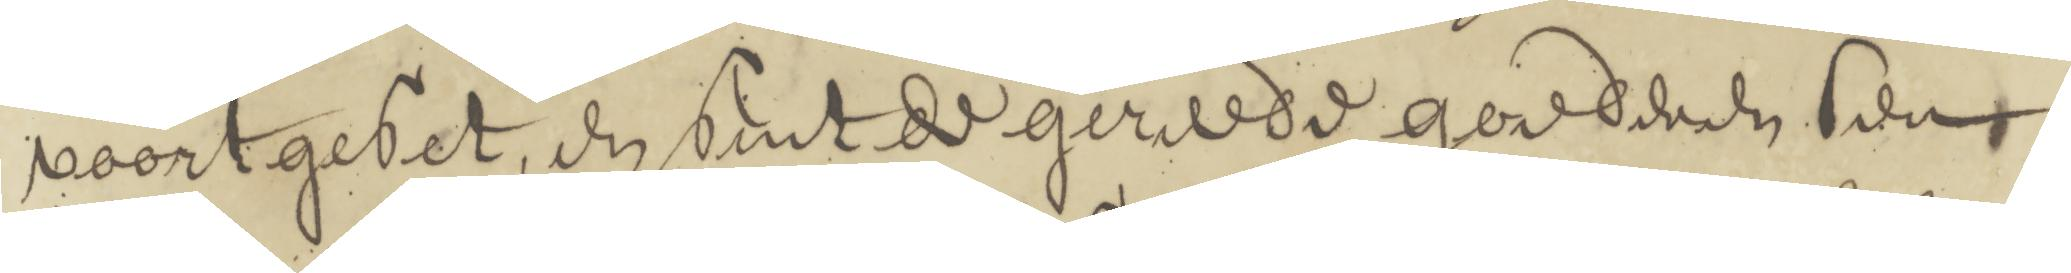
voortgeset, en sent de gereede goederen ten
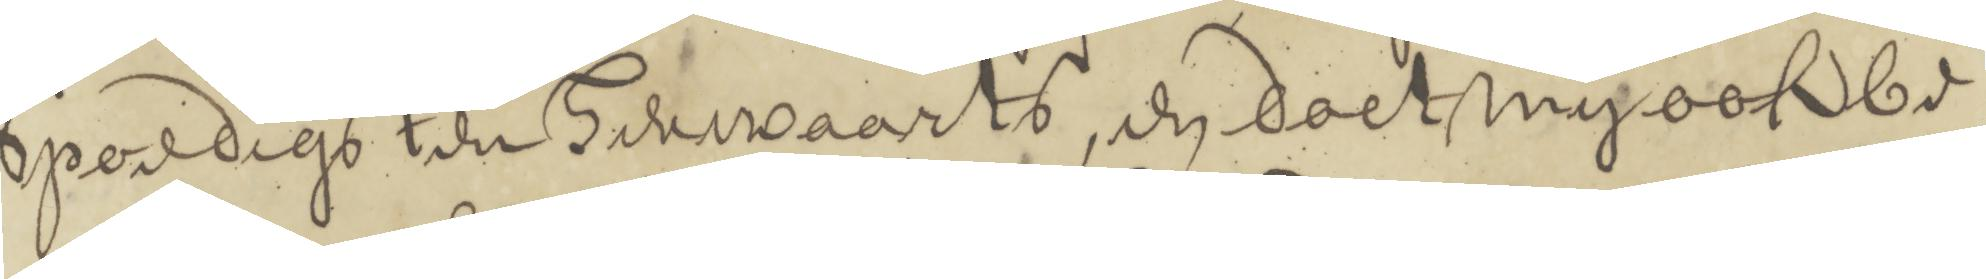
spoedigsten herwaarts, en doet mij ook be
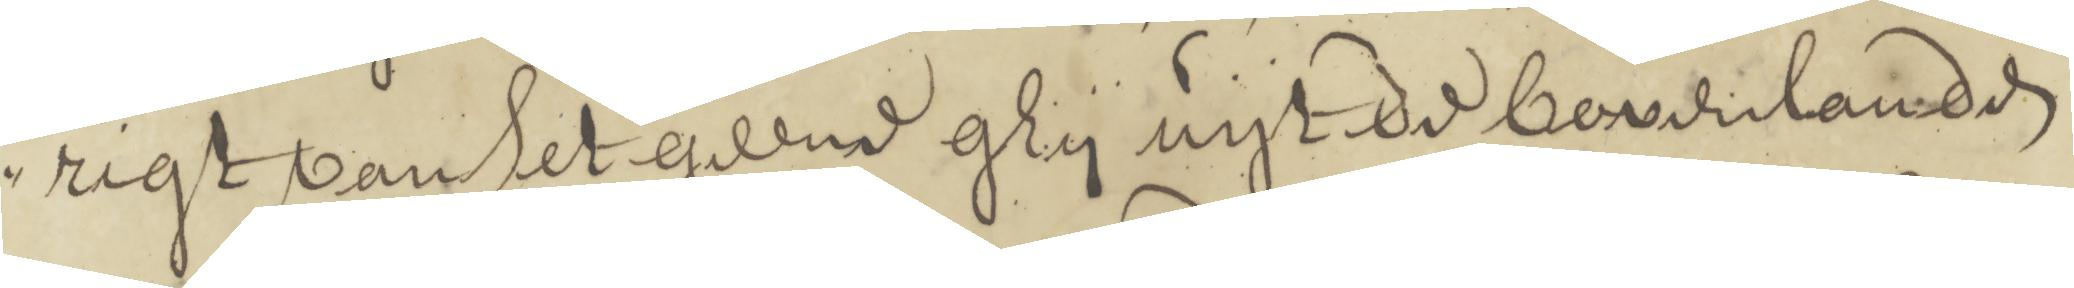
„rigt van het geene ghij uijt de bovenlanden
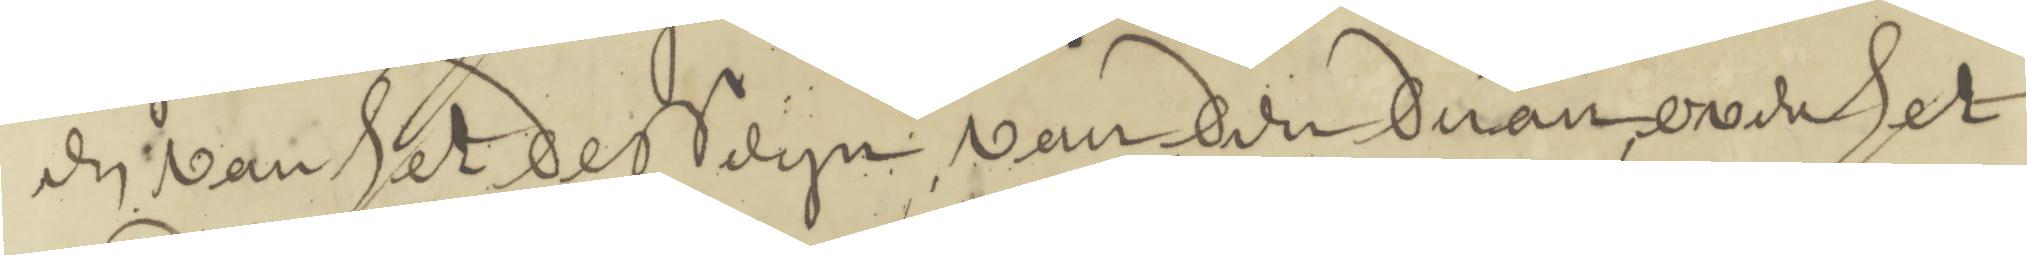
en van het desseijn, van den duan, over het
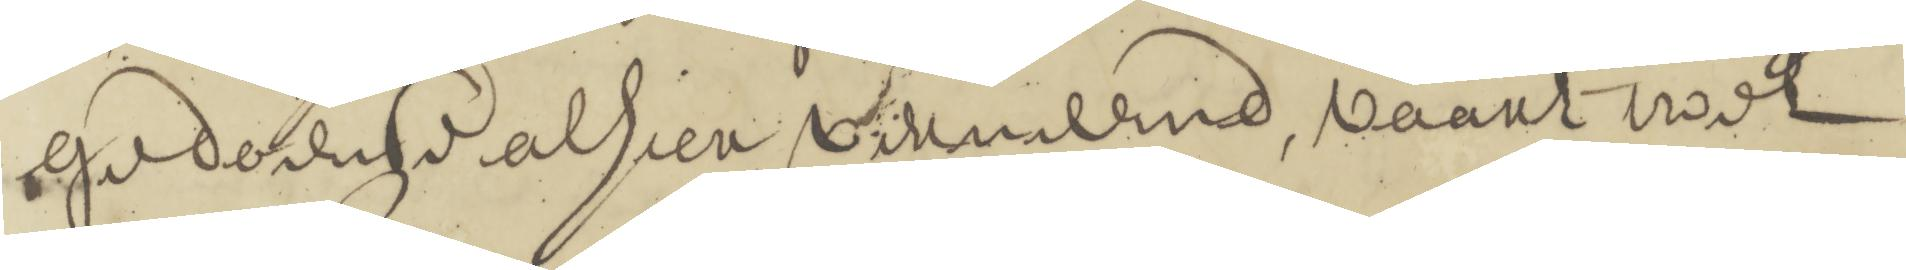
gedoente alhier verneemd, vaart wel.
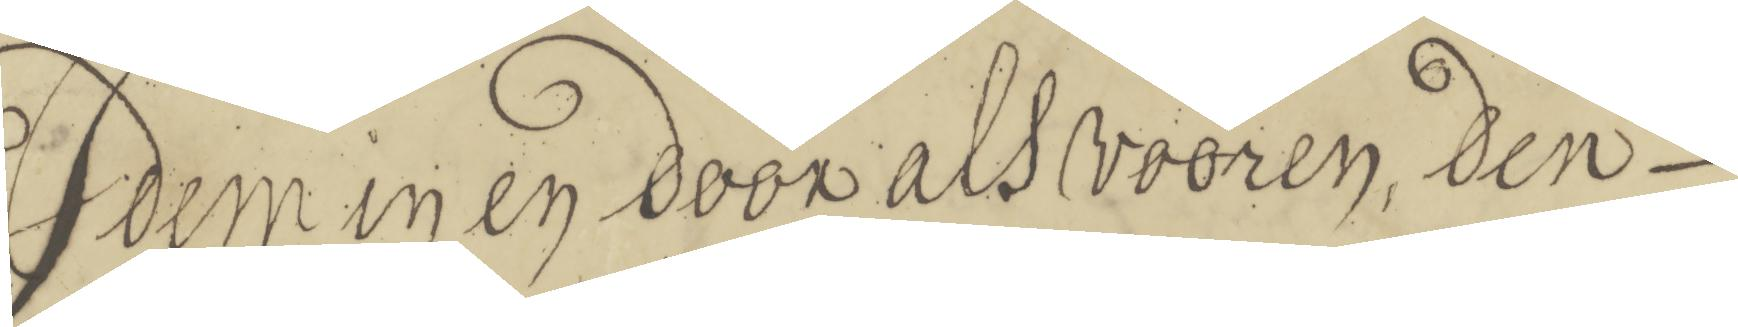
Jdem in en door als vooren, den
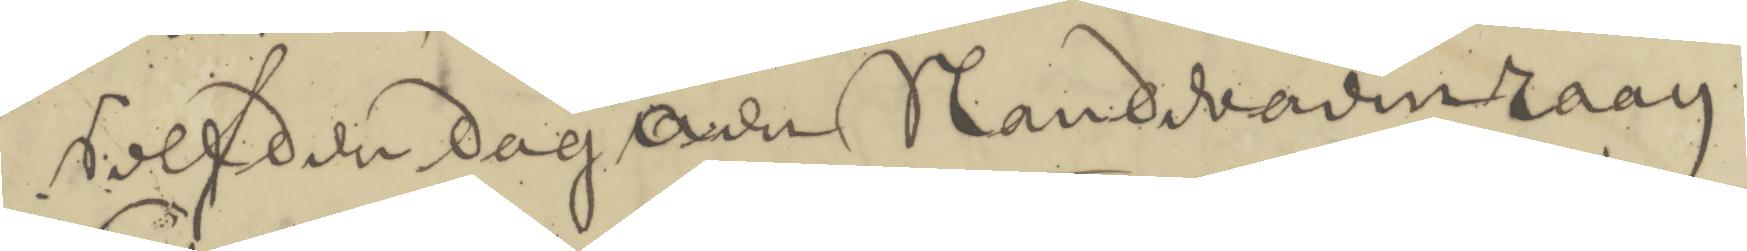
selfden dag aen Nanderaem raaij
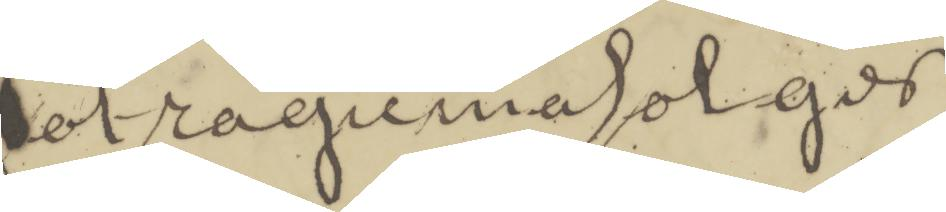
tot ragiemahol gesz
